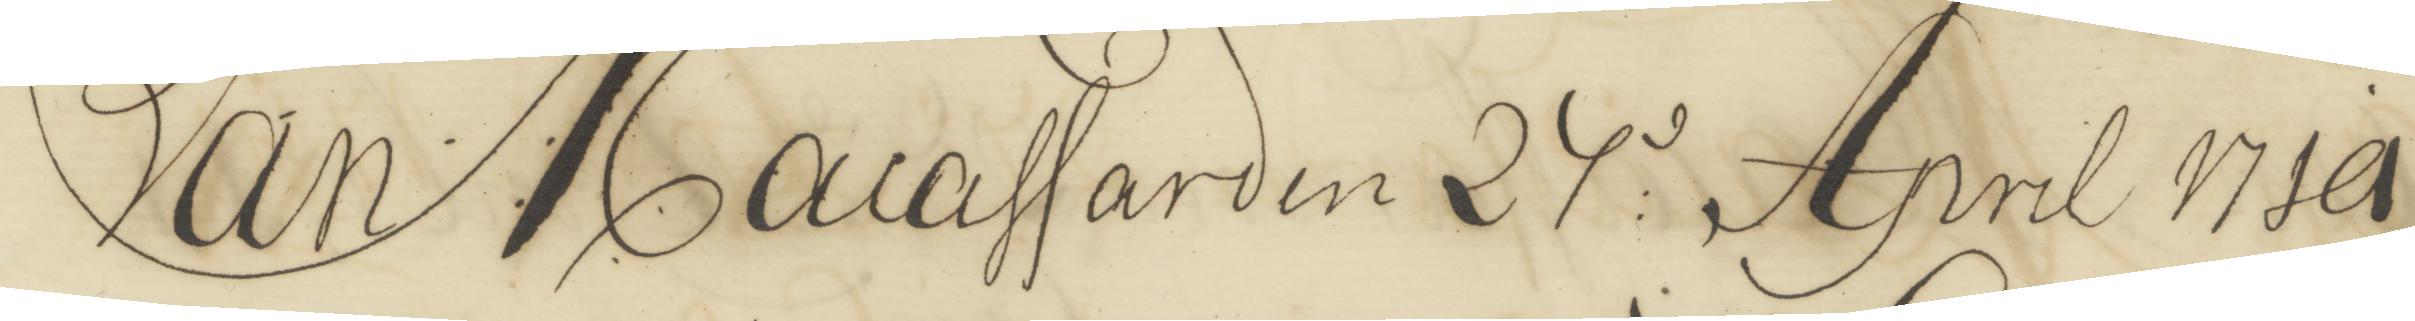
Van Macassar den 27:' April 1714
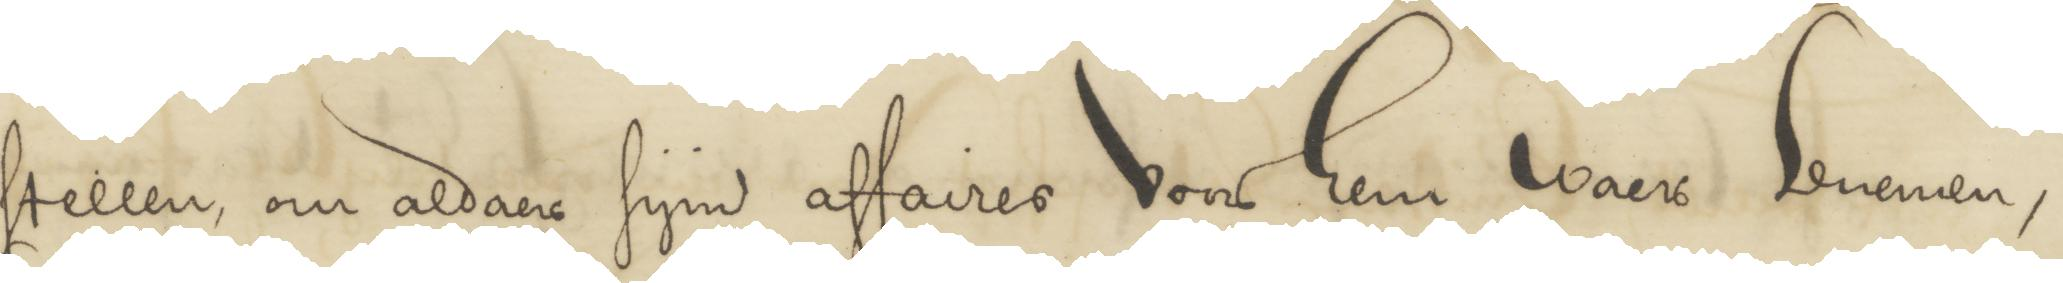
stellen, om aldaer sijne affaires voor hem waer tenemen,
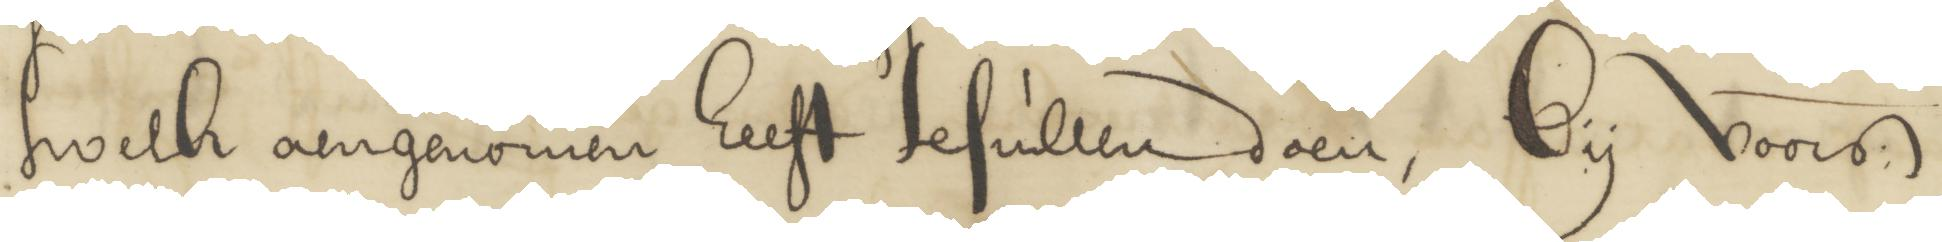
'twelk aengenomen heeft tesullen doen, bij voors:
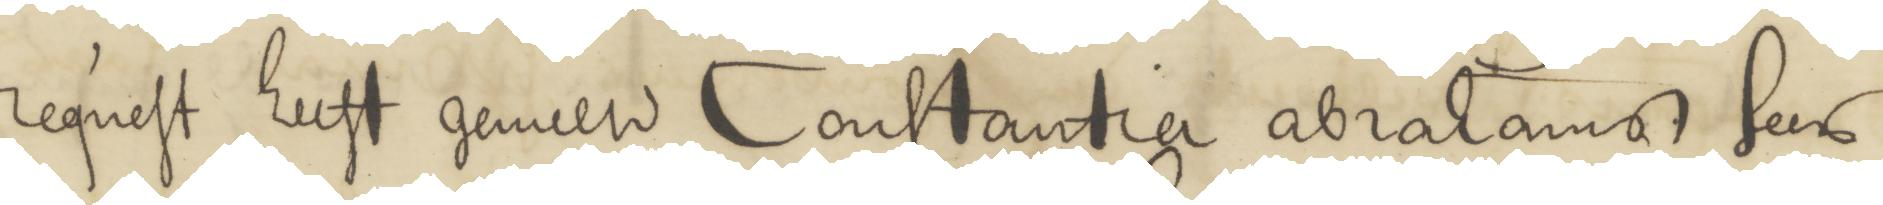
request heeft gemelte Constantia abrahams seer
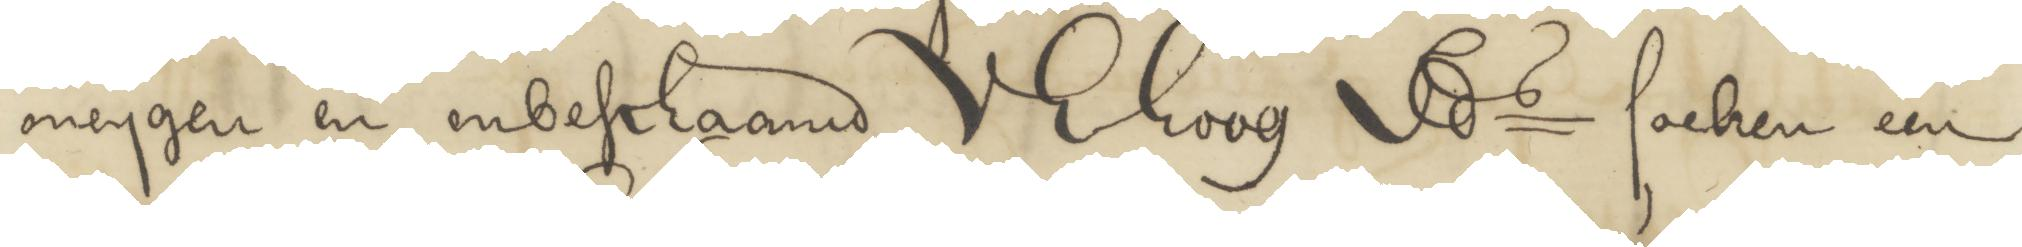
oneijgen en onbeschaand VE hoog Ed=s soeken een
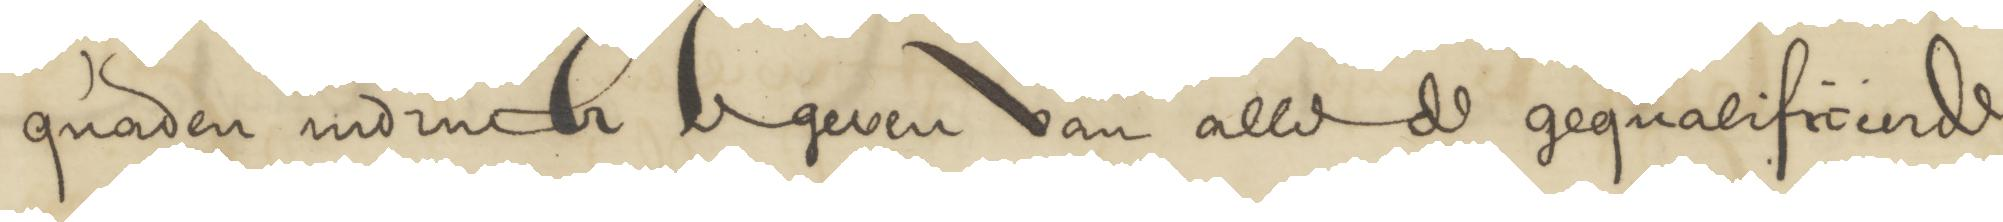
quaden indruck te geven van alle de gequalificeerde
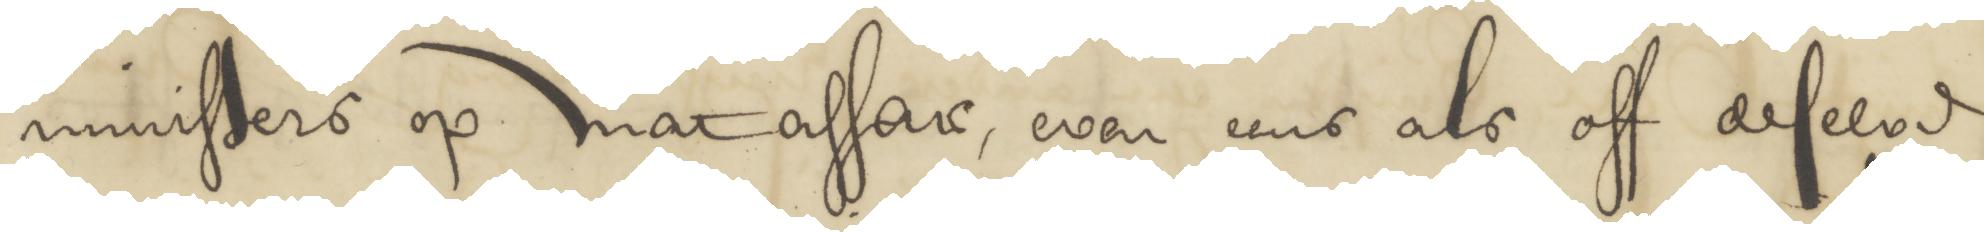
ministers op macassar, even eens als off deselve
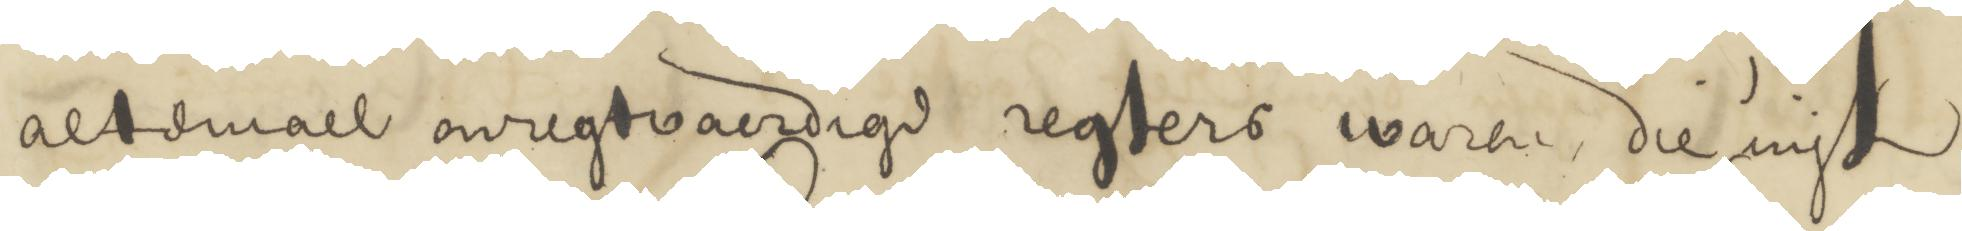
altemael onregtvaerdige regters waren, die uijt
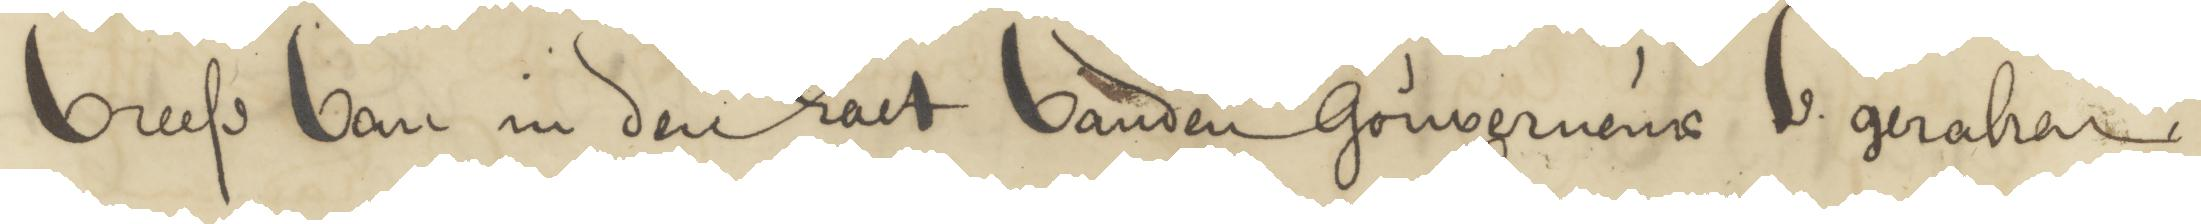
vreese van in den haet vanden gouverneur te geraken
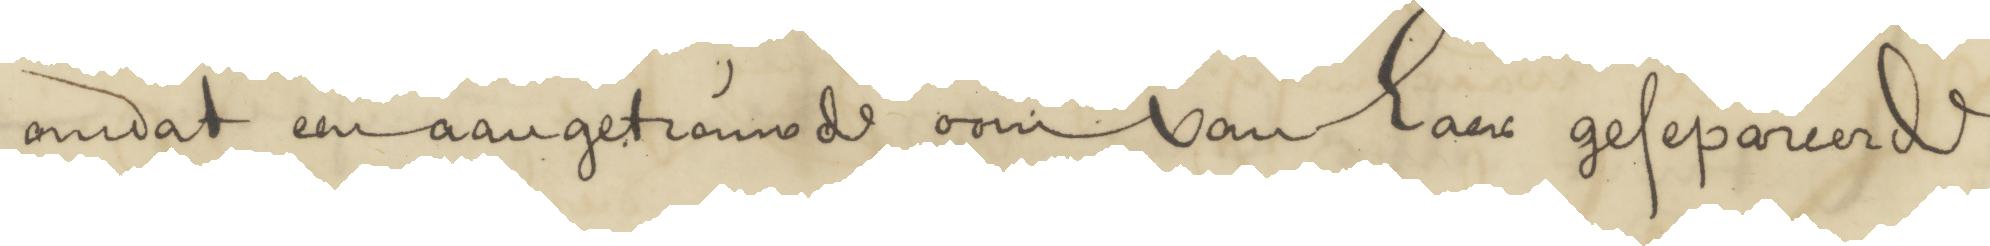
omdat een aangetrouwde oom van haer gesepareerde
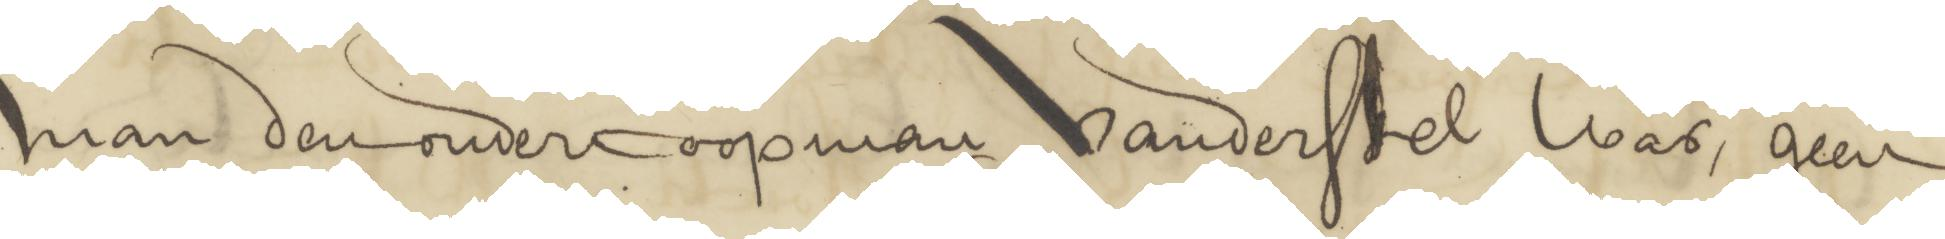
man den ondercoopman Vanderstel was, geen
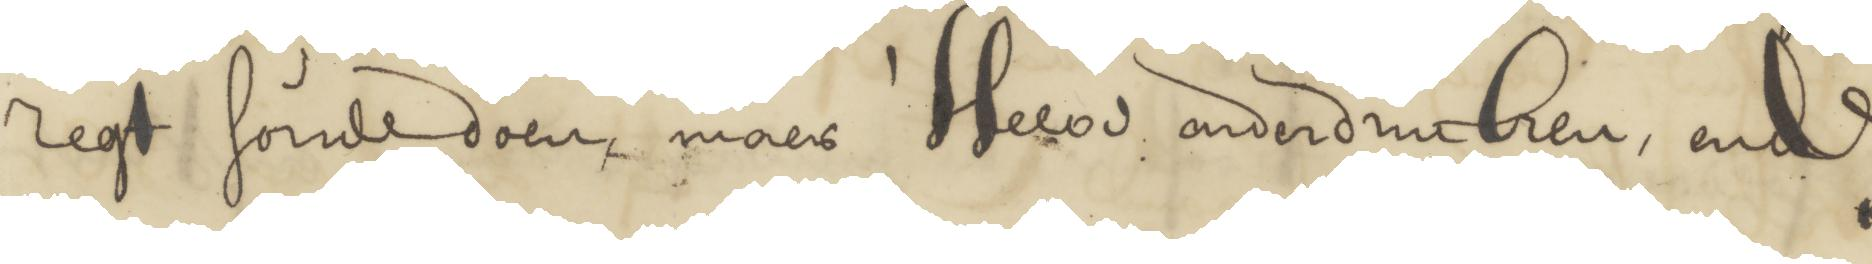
regt soude doen, maer 'tselve onderdrucken, ende
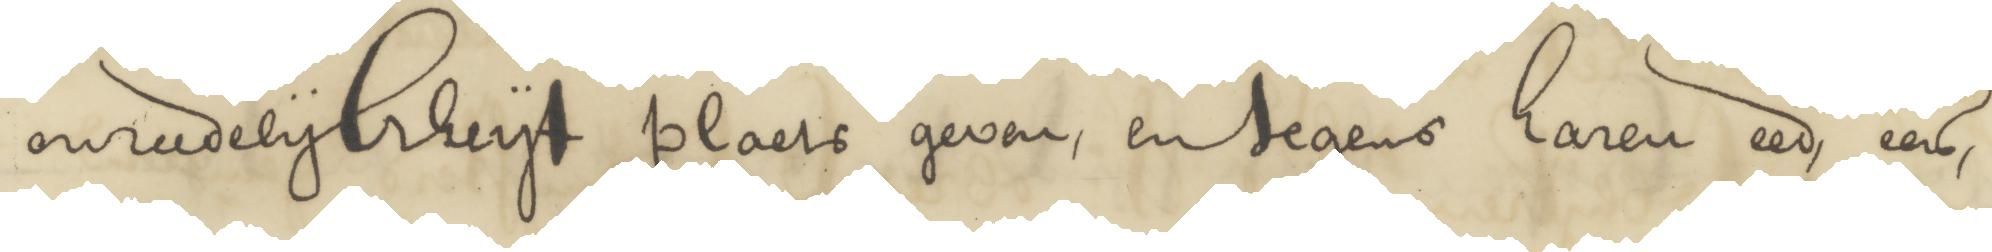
onreedelijkheijt plaets geven, en tegens haren eed, eer,
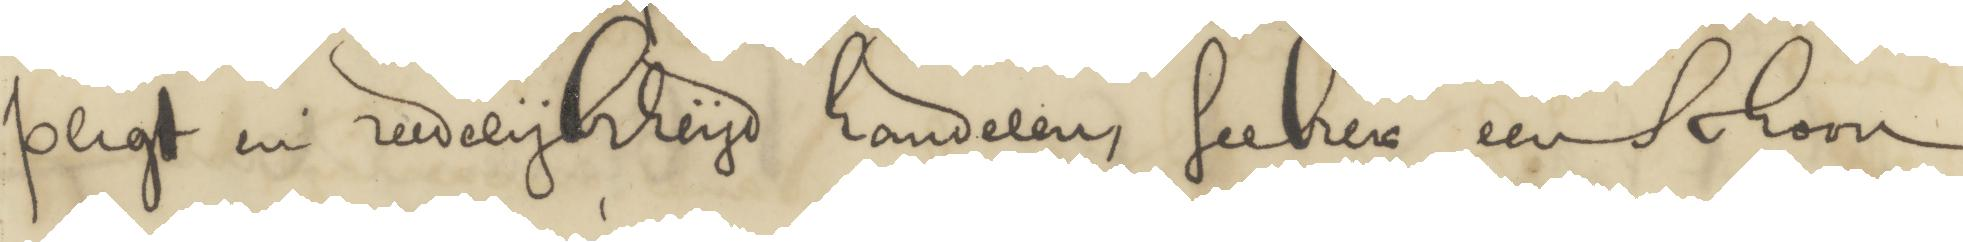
pligt en reedelijkheijd handelen, seeker een schoon
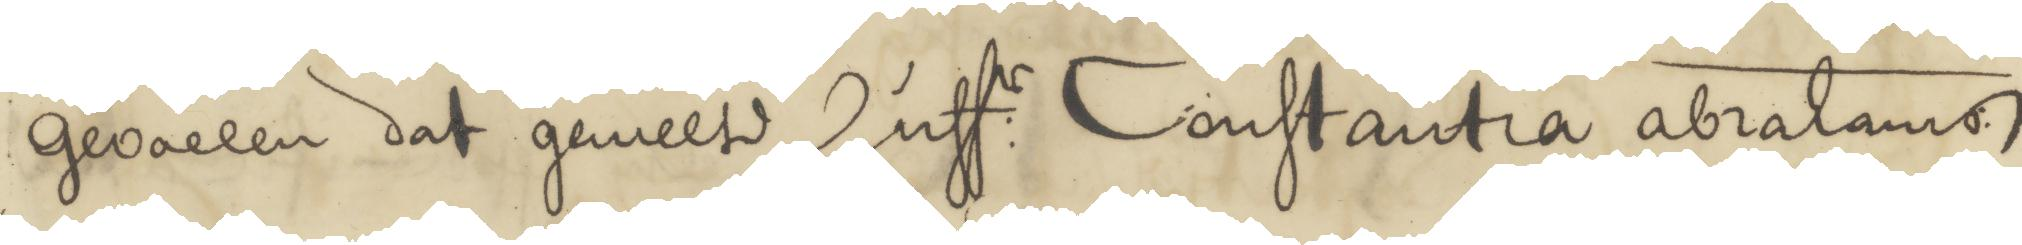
gevoelen dat gemelte Juff:r Constantia abrahams:
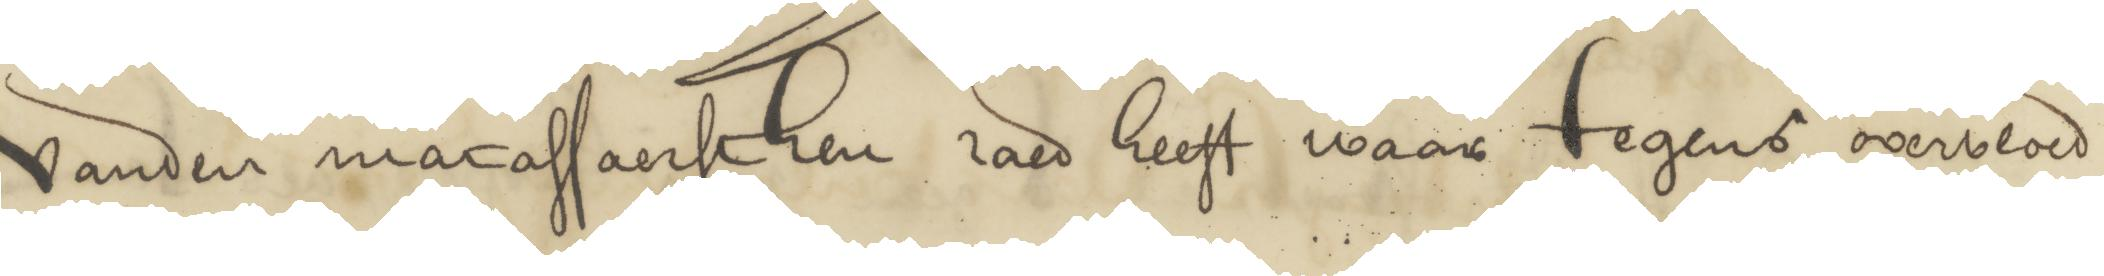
vanden macassaerschen raed heeft waar tegens overvloed
